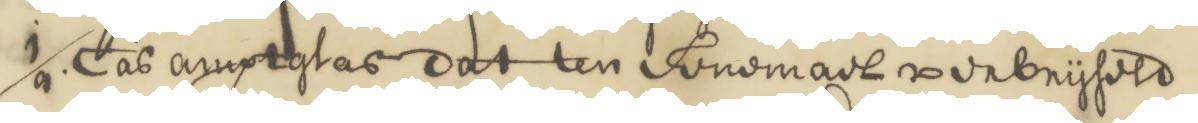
¼. cas amptgtas dat ten Eenemael verbrijseld
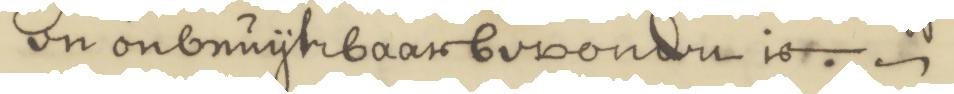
en onbruijk baar bevonden is. —
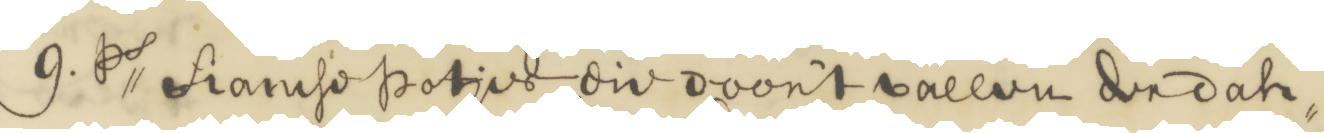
9. p„s franse potjes die door ’t vallen der dak
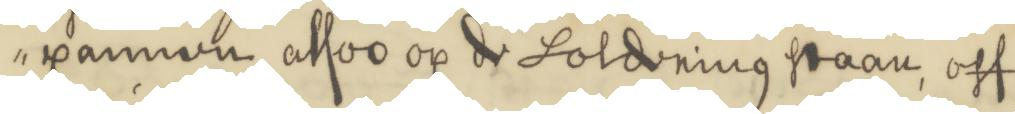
„pannen, alsoo op de soldering staan, off
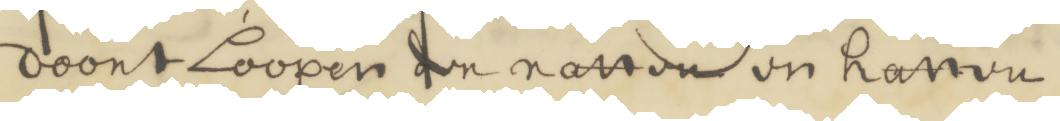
door't loopen der ratten en katten
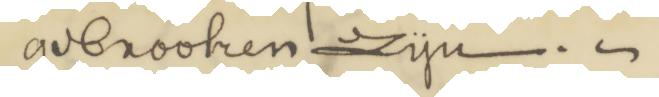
gebrooken zijn. —
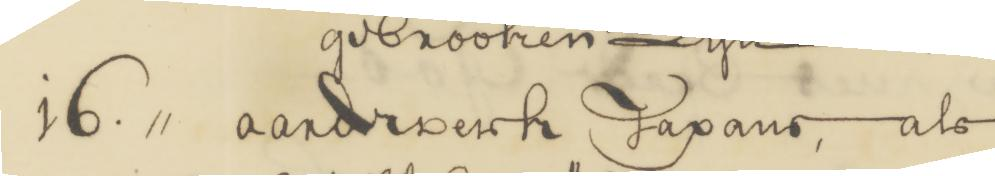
16. „ aardewerk Japans, als
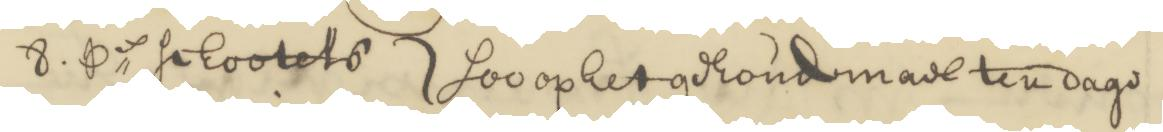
8. p„s schootels soo op het gehoude mael ten dage
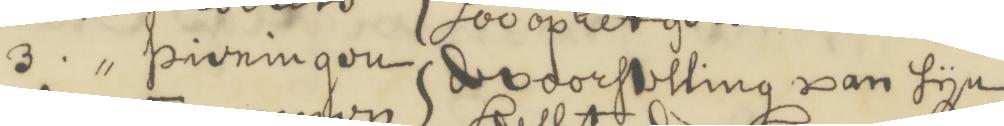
3. „ pieringen de voorstelling van sijn
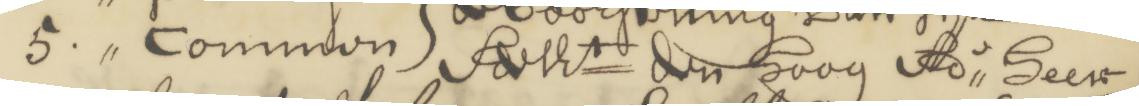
5. „ commen Edelh=t den Hoog Ed„s Heer
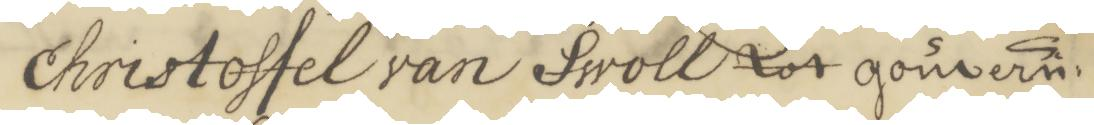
Christoffel van Swoll tot gouvern
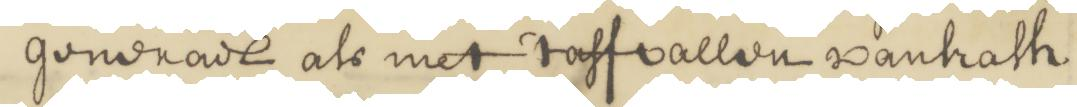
generael, als met ’t affvallen van kalk
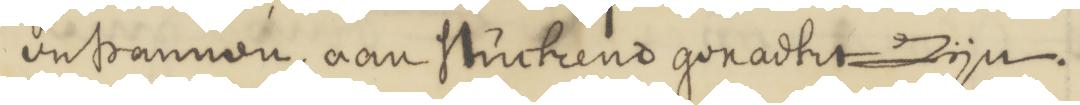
en pannen aan stuckend geraekt zijn.
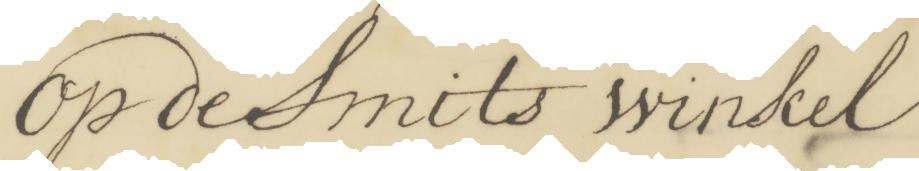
op de Smits winkel
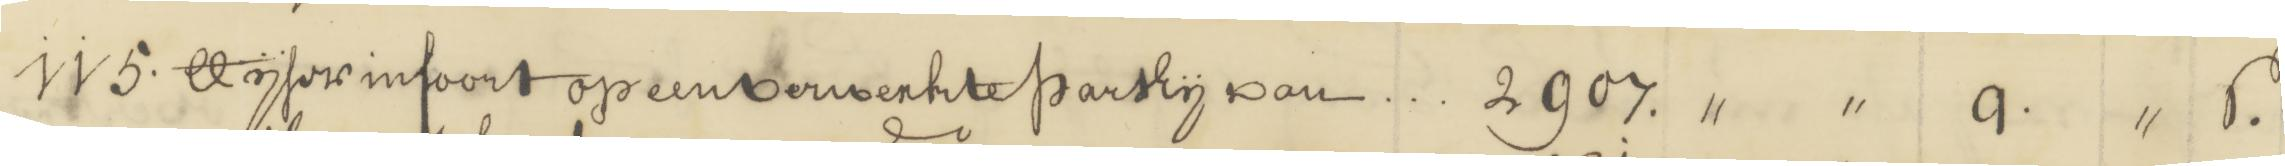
115. lb ijser insoort op een verwerkte parthij van . . . 2907. „ „ 9. „ t.
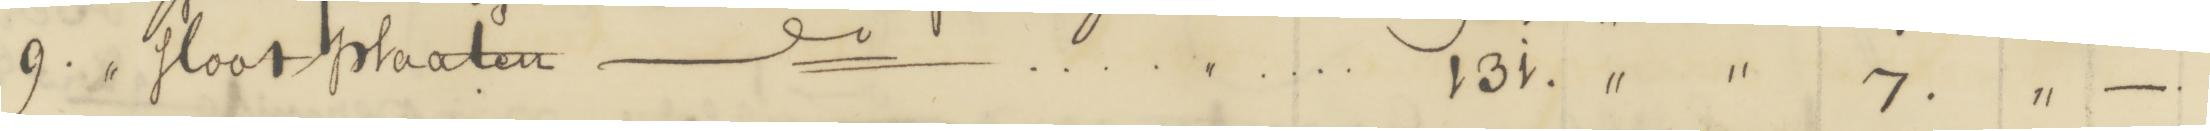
9. „ sloot plaaten _=o . . . . „ . . . . 131. „ „ 7. „ —.
